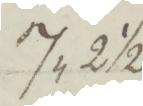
7„ 2½
